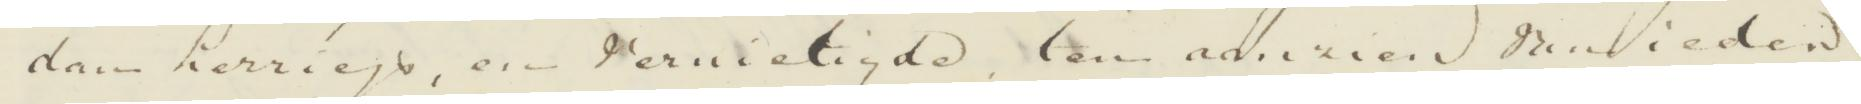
dan herriep, en vernietigde, ten aanzien van ieder
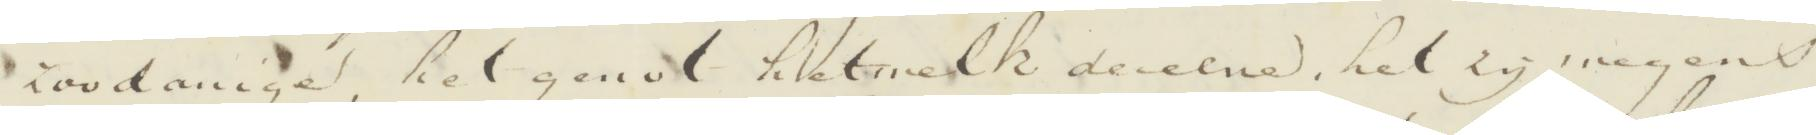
zoodanige, het genot hetwelk dezelve, het zij wegens
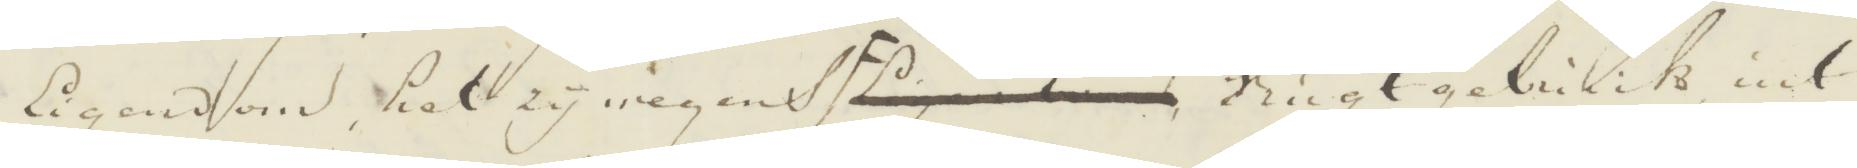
Eigendom, het zij wegens ¶ Eigendom vrugtgebruik uit
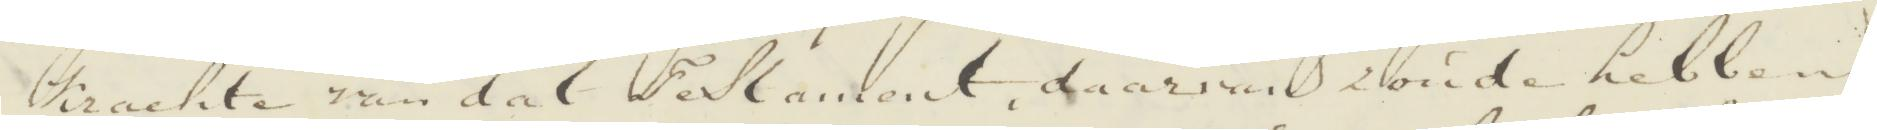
krachte van dat Testament, daarvan zoude hebben
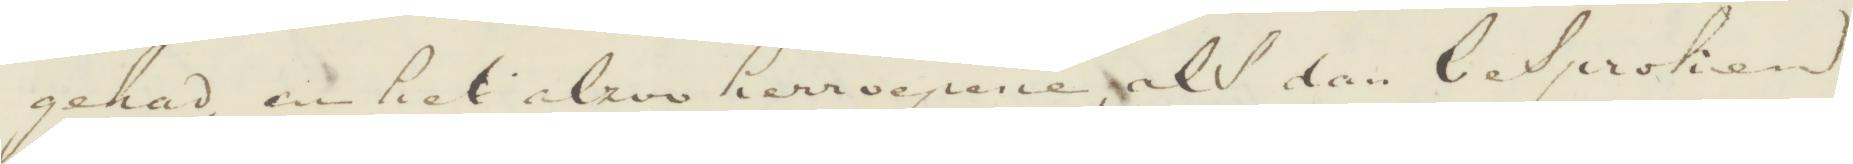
gehad, in het alzoo herroepene, als dan besproken
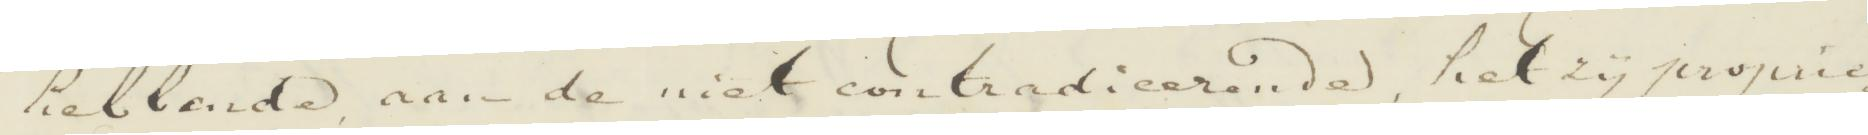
hebbende, aan de niet contradicerende, het zij proprie„
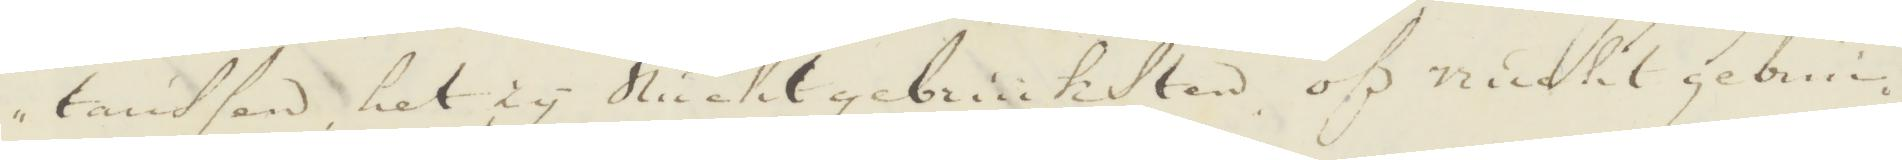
„tarissen, het zij vruchtgebruikster, of vrucht gebrui„
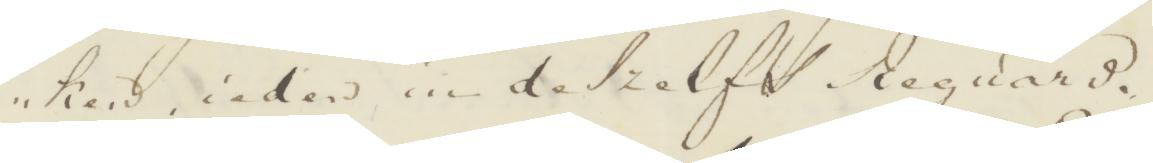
„ker, ieder in deszelfs Reguard.
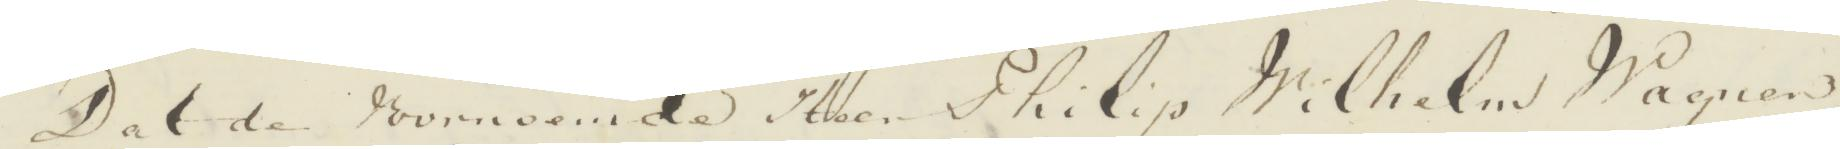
Dat de voornoemde Heer Philip Wilhelm Wagner
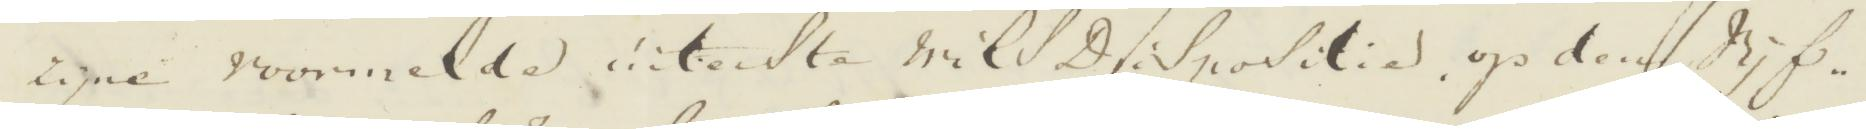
zijne voormelde uiterste wils Dispositie, op den Vijf„
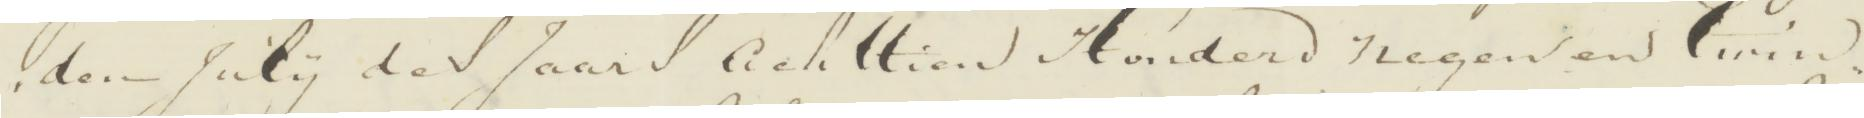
„den Julij des Jaars achttien Honderd negen en twin„
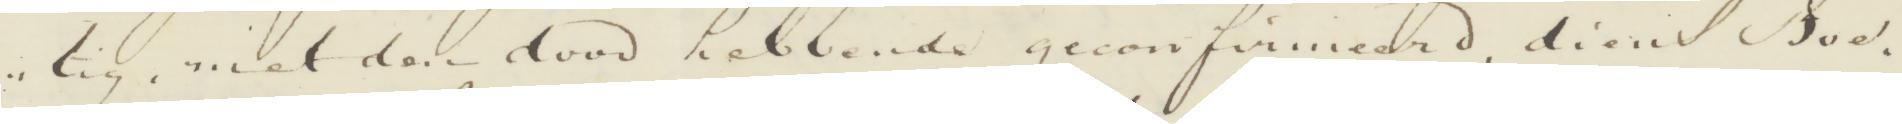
„tig, met den dood hebbende geconfirmeerd, diens Boe„
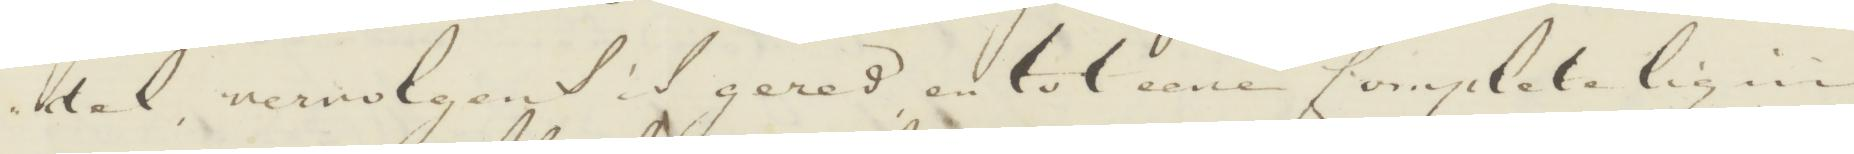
„del, vervolgens is gered, en tot eene Complete liqui
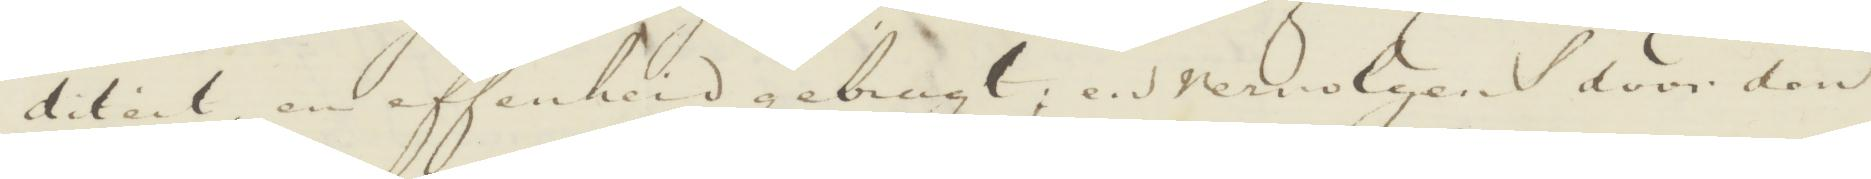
diteit, en effenheid gebragt; en vervolgens door den
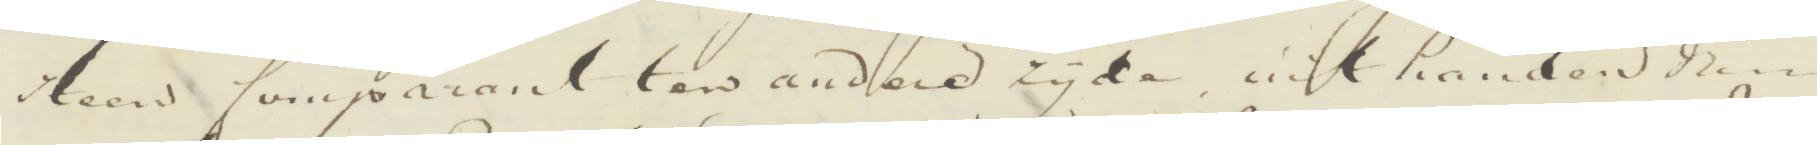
Heer Comparant ten andere zijde, uit handen van
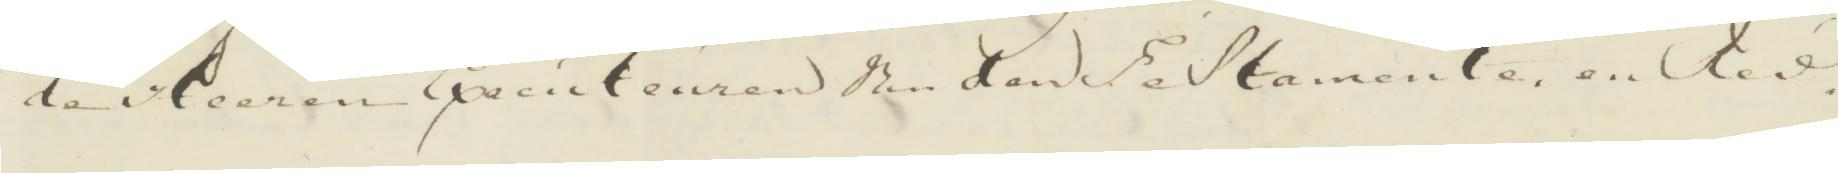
de Heeren Executeuren van den Testamenten en Red„
